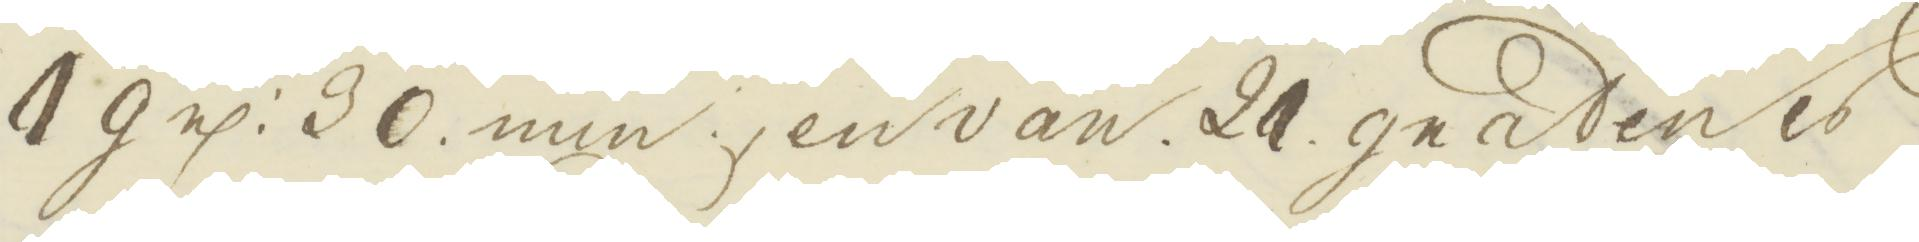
49 rs: 30. min, en van 24. graden is
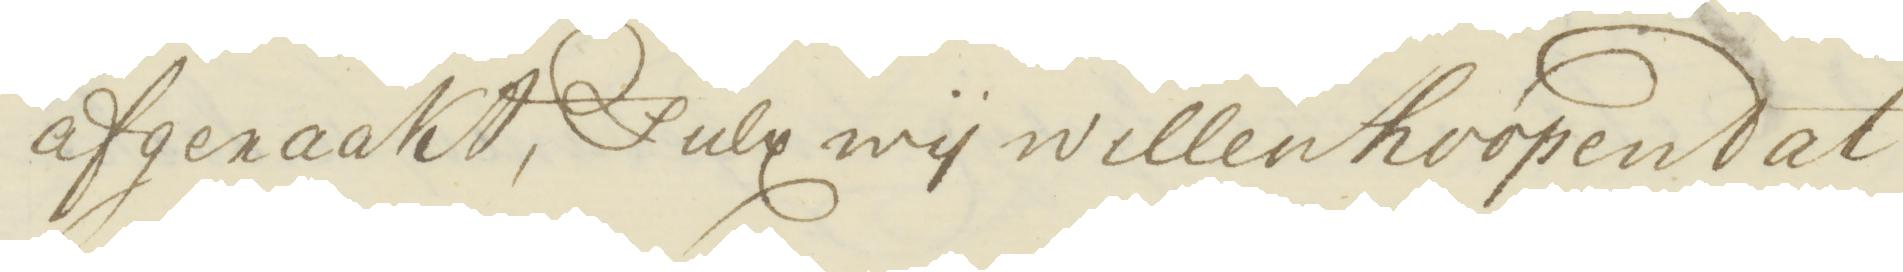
afgeraakt, Sulx wij willen hoopen dat
